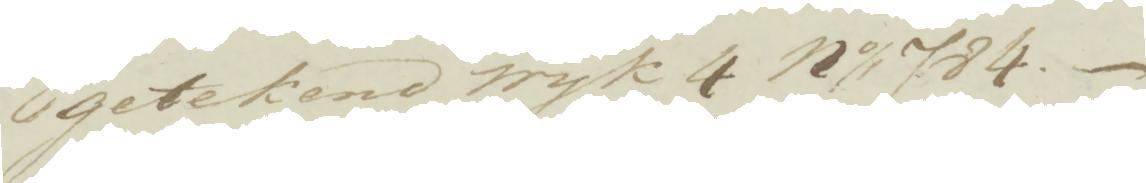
getekend wyk 4 N„o 784.
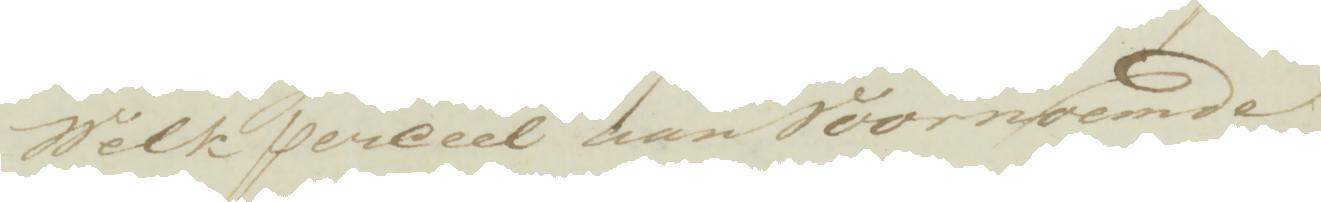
Welk perceel aan Voornoemde
